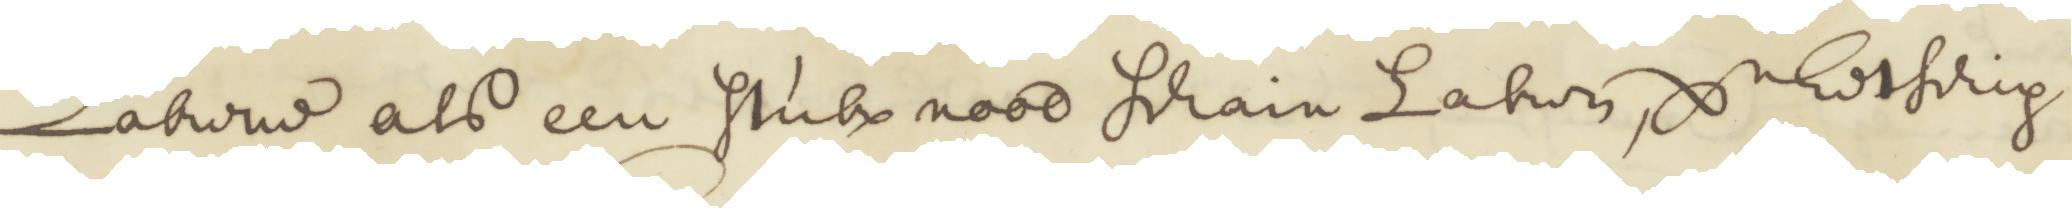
Lakene als een stuk rood schair Laken, pr hetschip
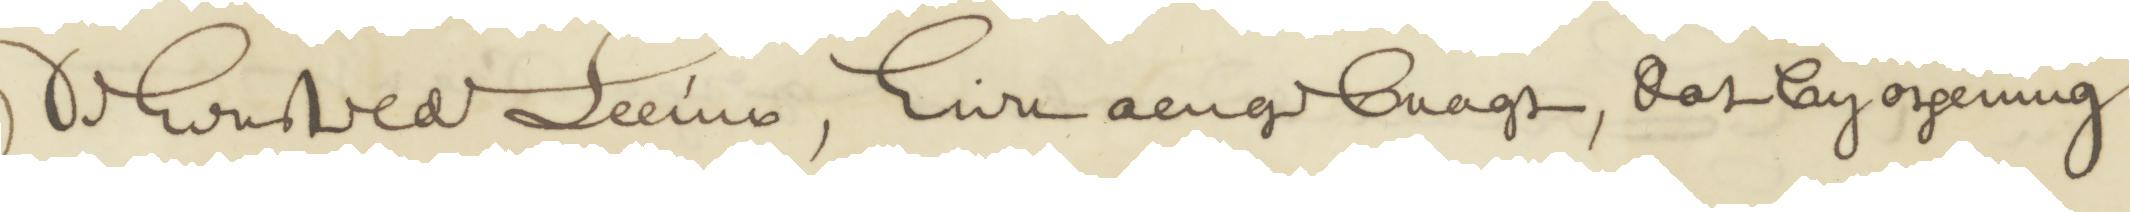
de herstelde Leeuw, hier aengebragt, dat by opening
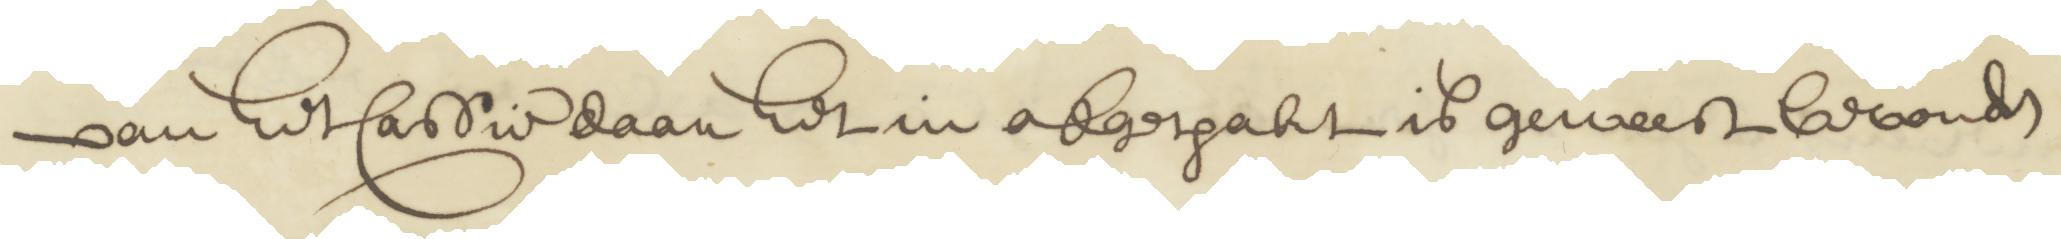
van het Cassie daar het in afgepakt is geweest bevonden
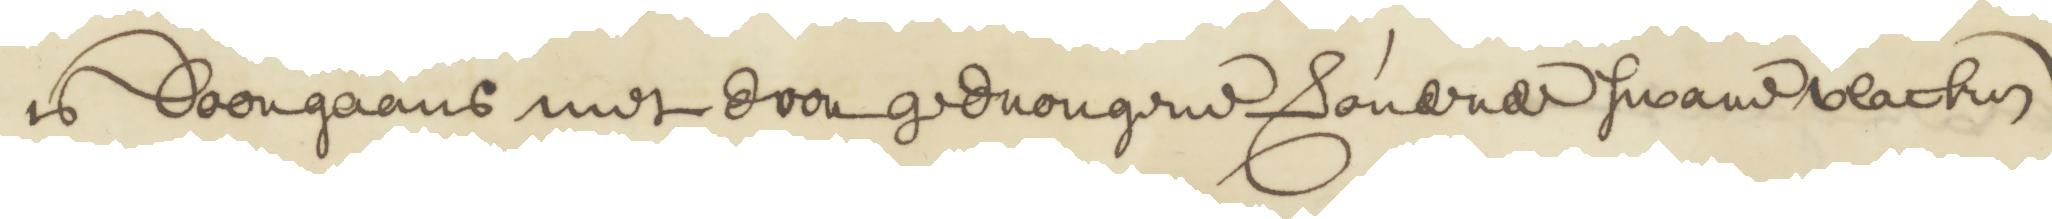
is doorgaans met door gedrongene verouderde sware vlacken
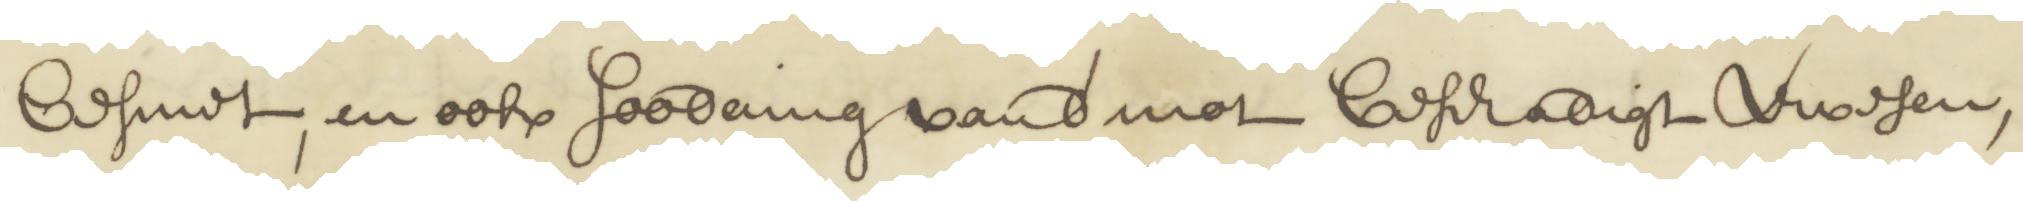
besmet, en ook soodaing vand’ mot beschadigt tewesen,
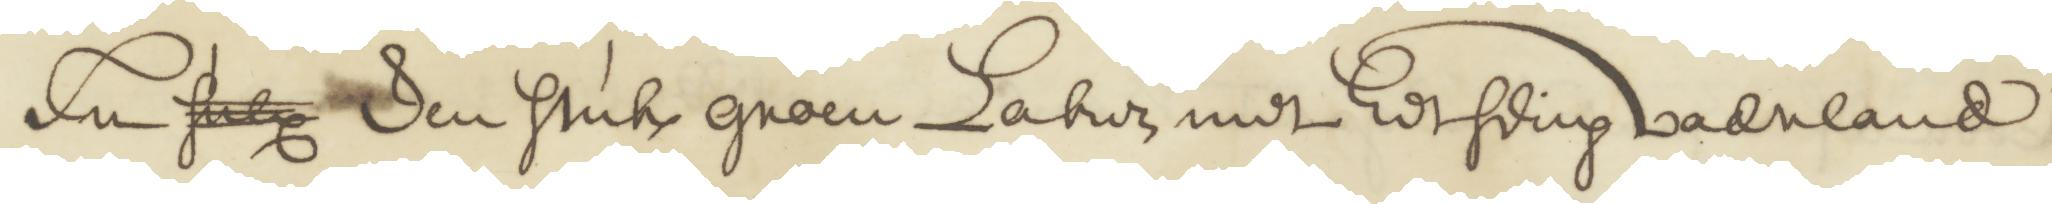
En sulx Een stuk groen Laken met hetschip Vaderland
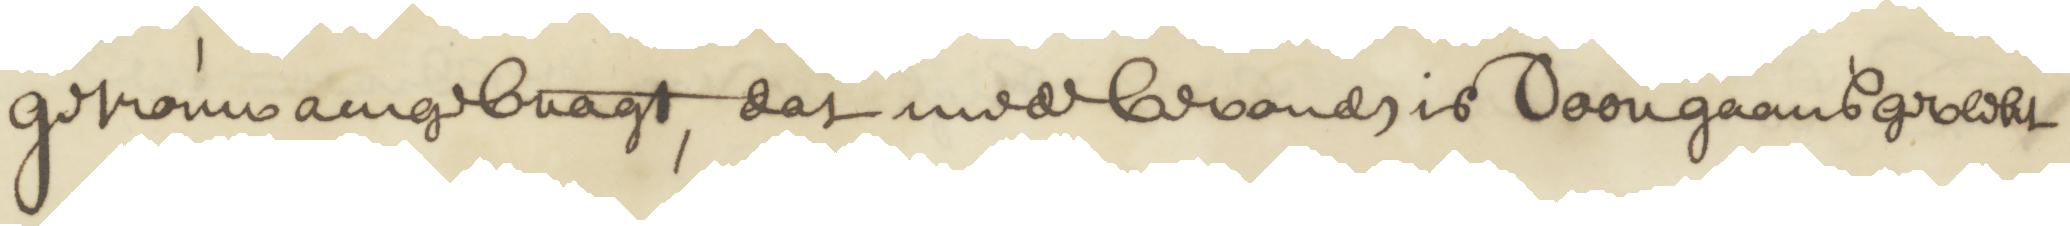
getrouw aengebragt, dat medebevonden is Doorgaans gevlekt
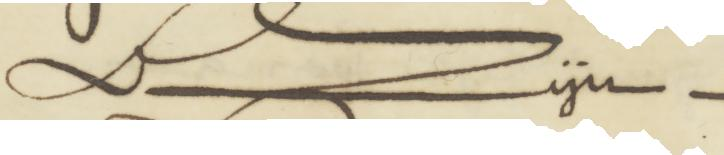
te Zijn
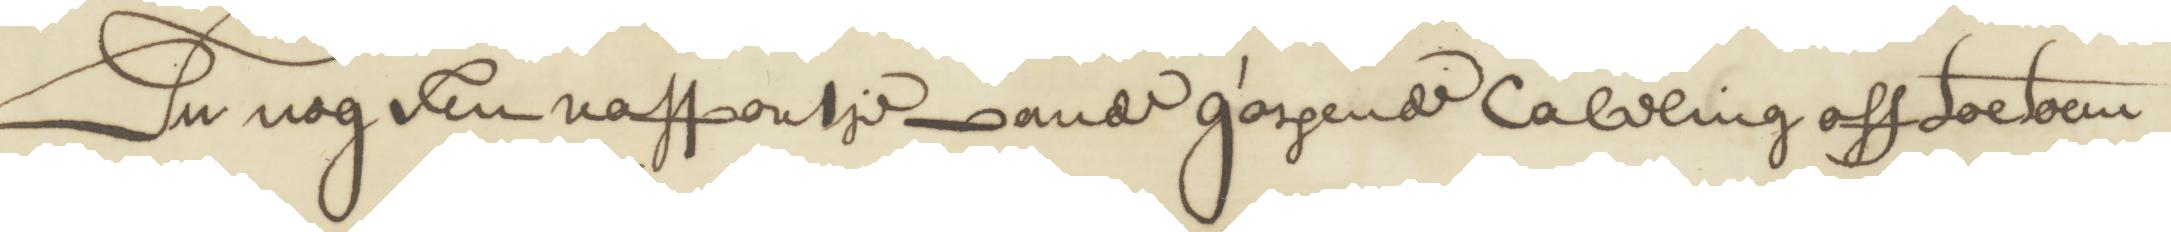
En nog Een rapportje vande g'opende Cabeling off toetoon
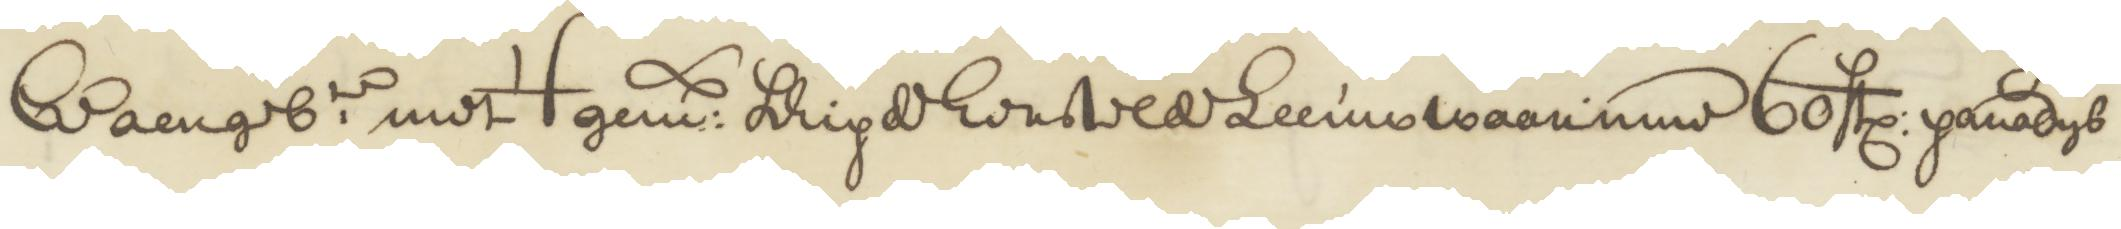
be aergeb:te met ’t gem: schip deherstelde Leeuw waarinne 60 stx: paradijs
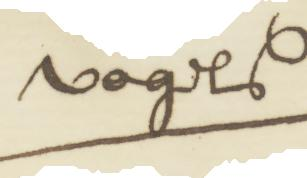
vogels
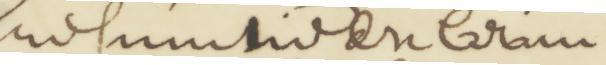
resumtie der bevin
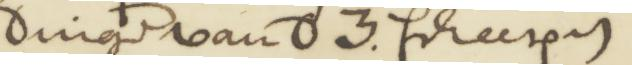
dinge van d' 3. scheepen
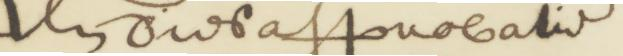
En dies approbatie
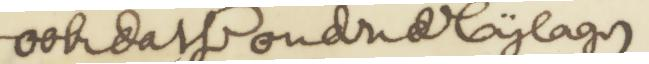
ookdatse onderdebijlagen
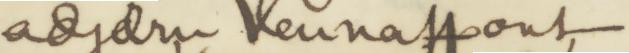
adjdrie Een rapport,
